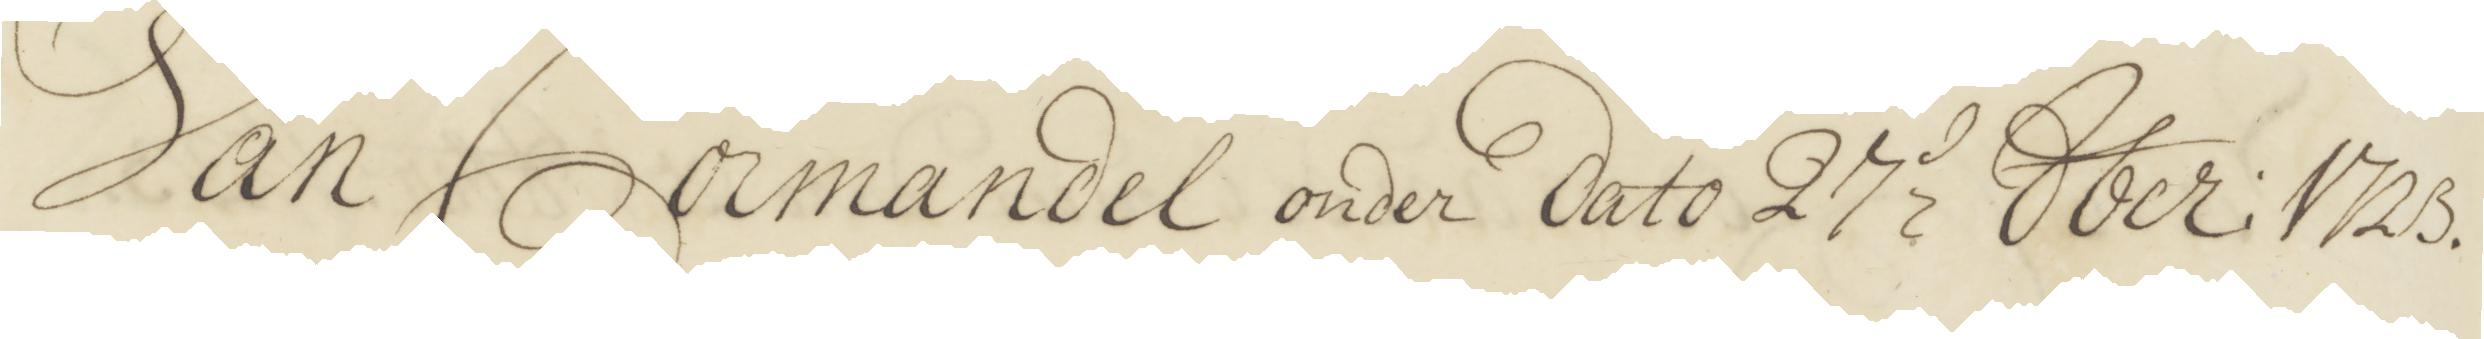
Van Cormandel onder dato 27:e 8ber: 1723.
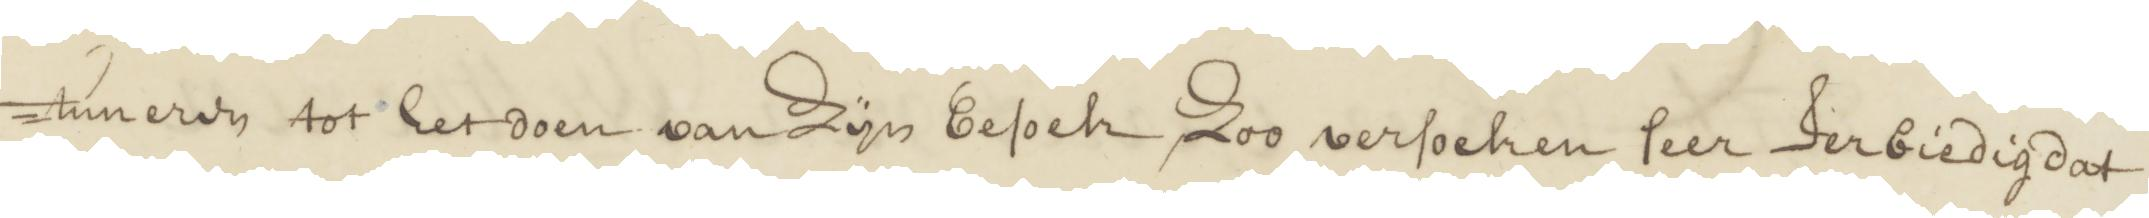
„tuneren tot het doen van zijn besoek, zoo versoeken seer Eerbiedig dat
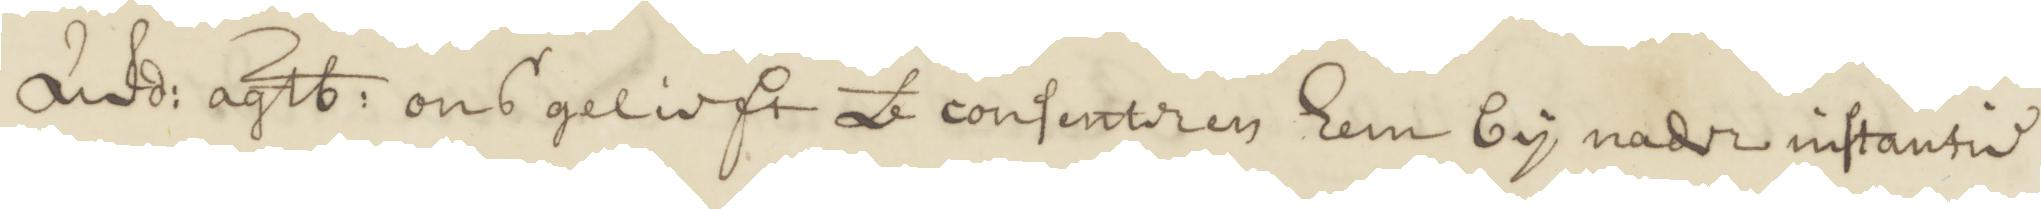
uEd: agtb: ons gelieft te consenteren hem bij nader instantie
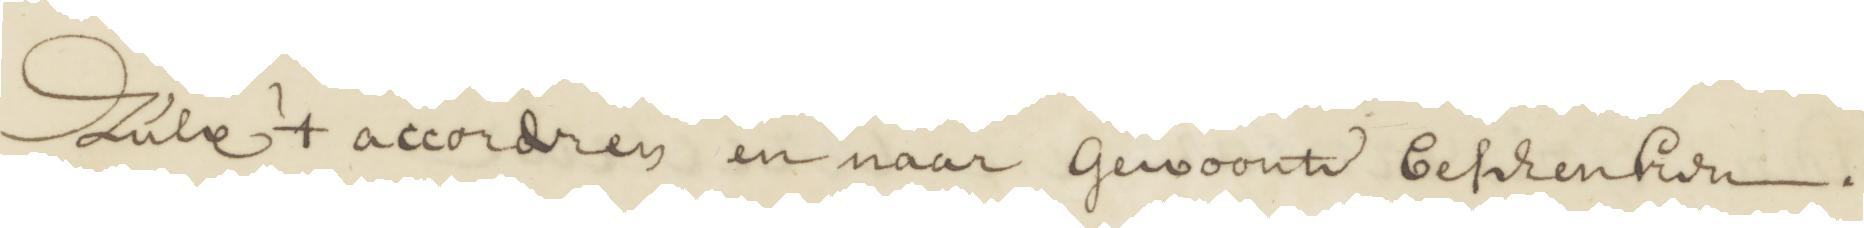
zulx ’t accorderen en naar Gewoonte beschenken.
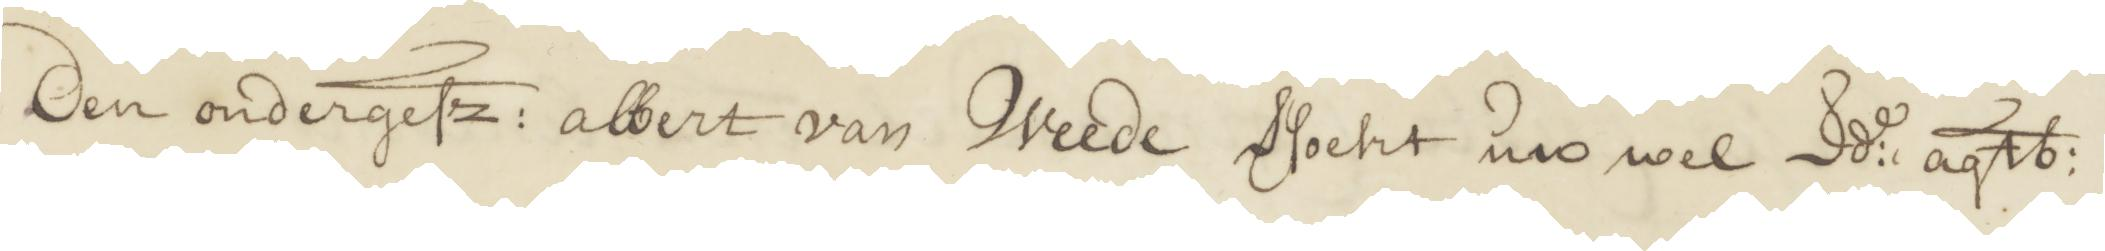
den ondergesz: albert van Weede versoekt uw wel Ed:e agtb:
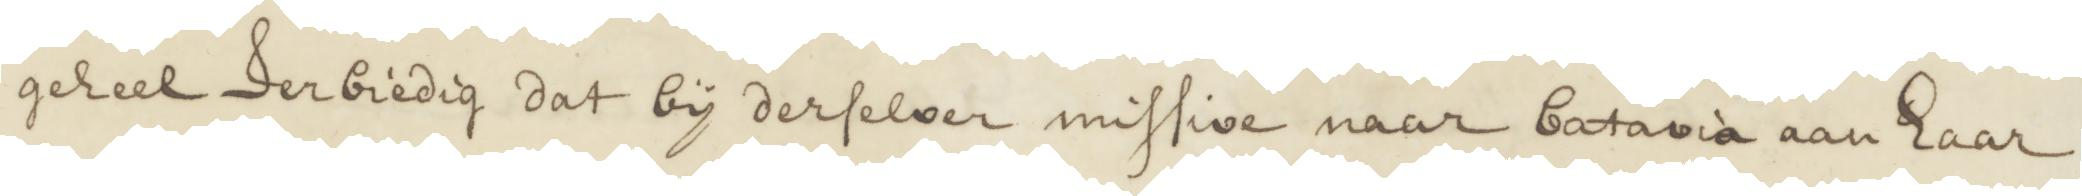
geheel Eerbiedig dat bij derselver missive naar batavia aan haar
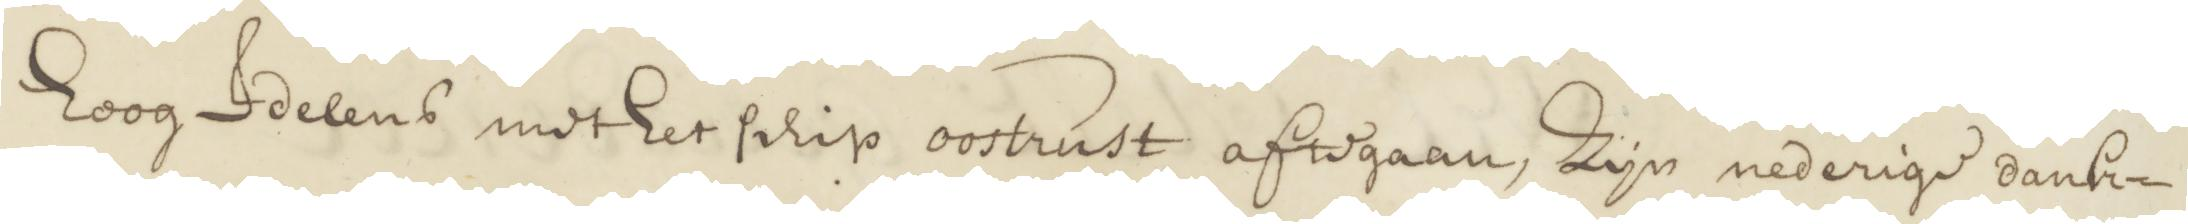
hoog Edelens met het schip oostrust aftegaan, zijn nederige dank„
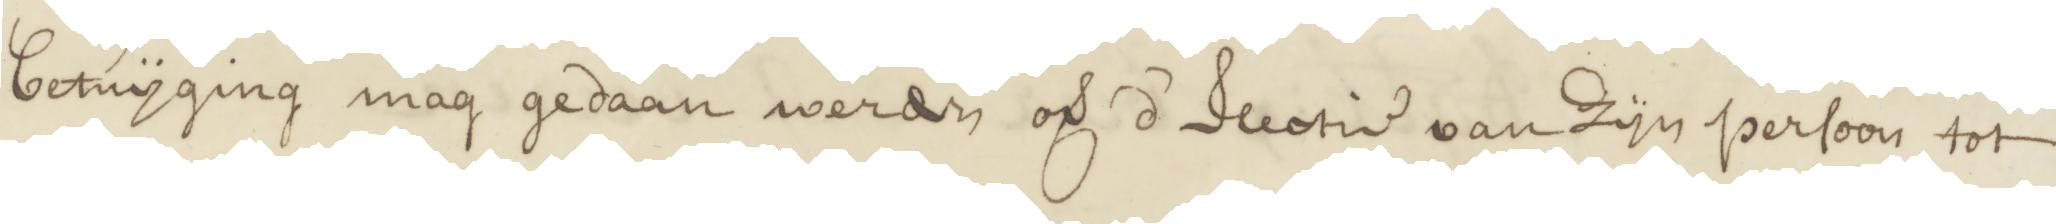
betuijging mag gedaan werden over d’ Electie van zijn persoon tot
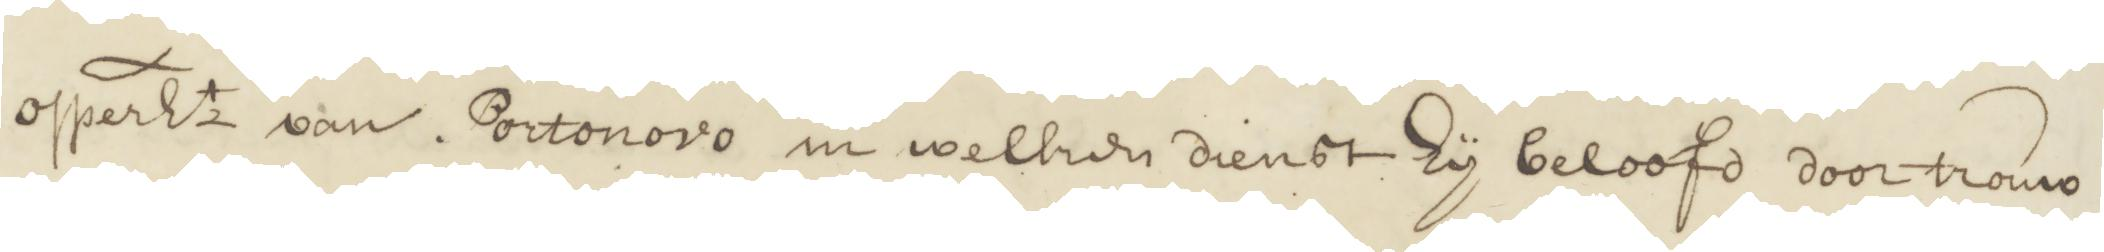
opperh=t van Portonovo in welken dienst hij beloofd door trouw
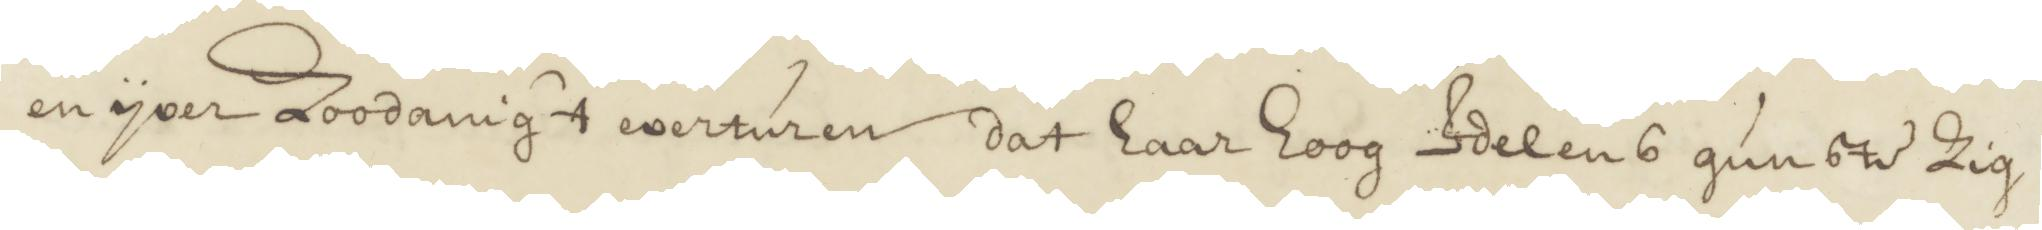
en ijver zoodanig ’t everturen dat haar hoog Edelens gunste zig
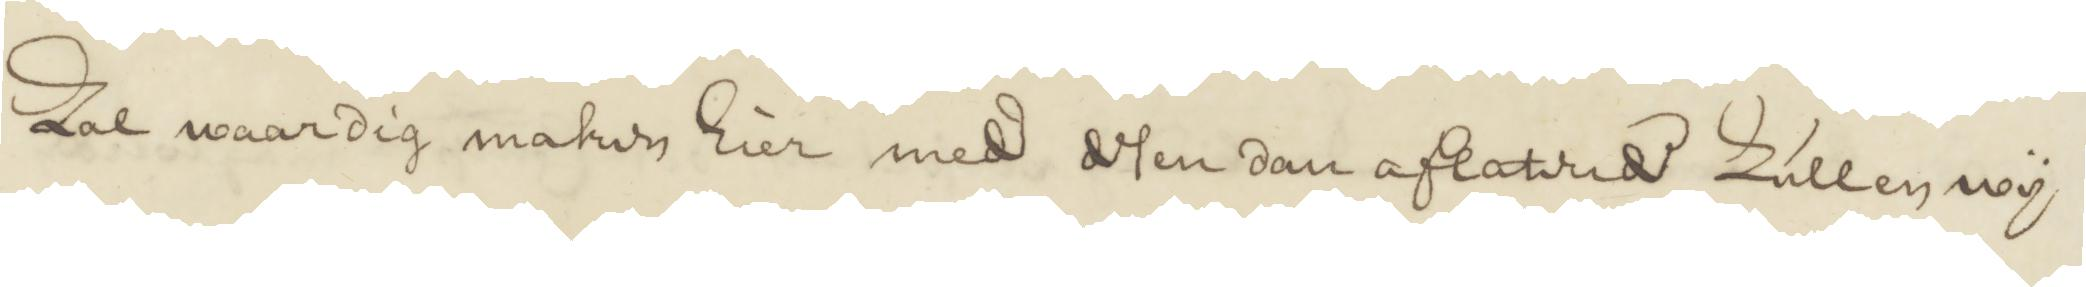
zal waardig maken hier mede desen dan aflatende zullen wij
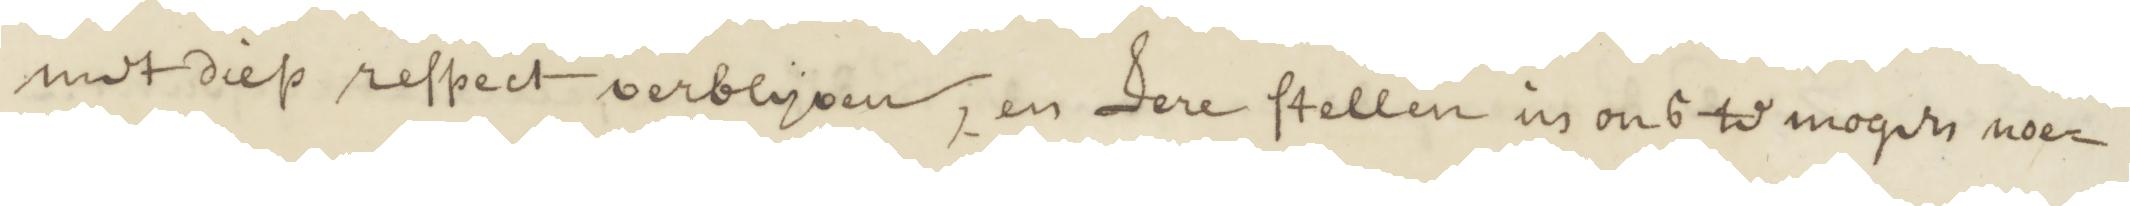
met diep respect verblijven, en Eere stellen in ons te mogen noe
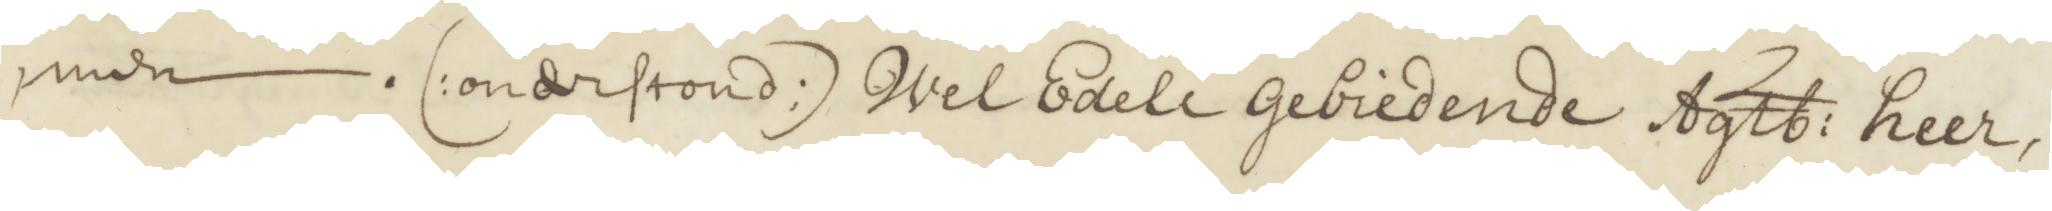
,men. (:onderstond:) Wel Edele Gebiedende Agtb: heer,
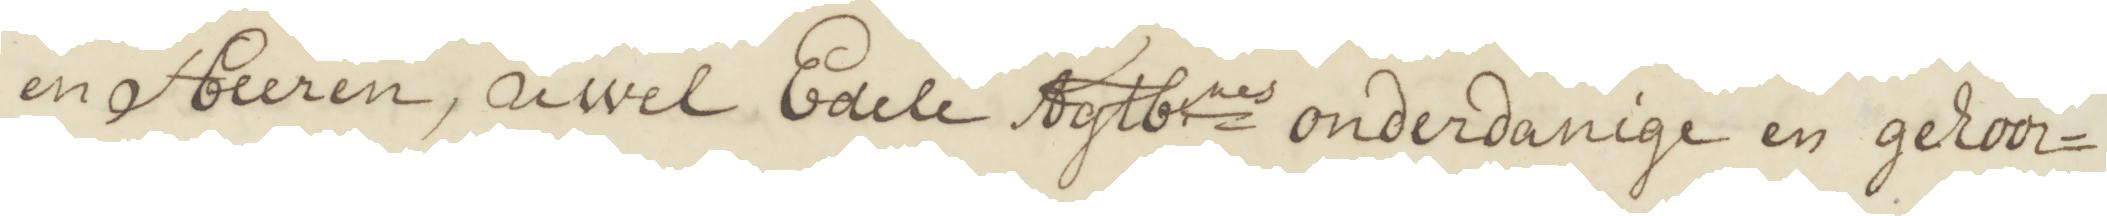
en Heeren, uwel Edele Agtb=res onderdanige en gehoor„
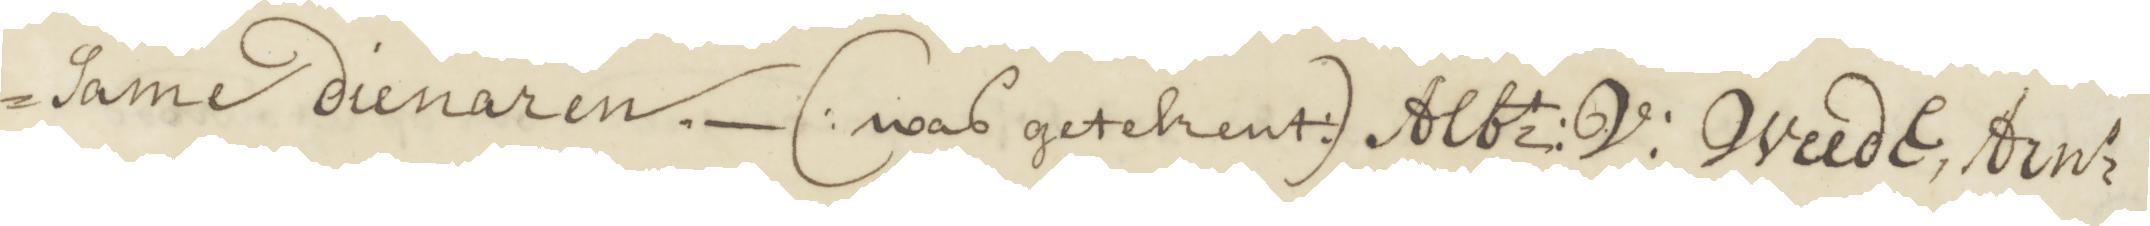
„same dienaren. — (:was getekent:) Alb=t: V: Weede, Arn:s
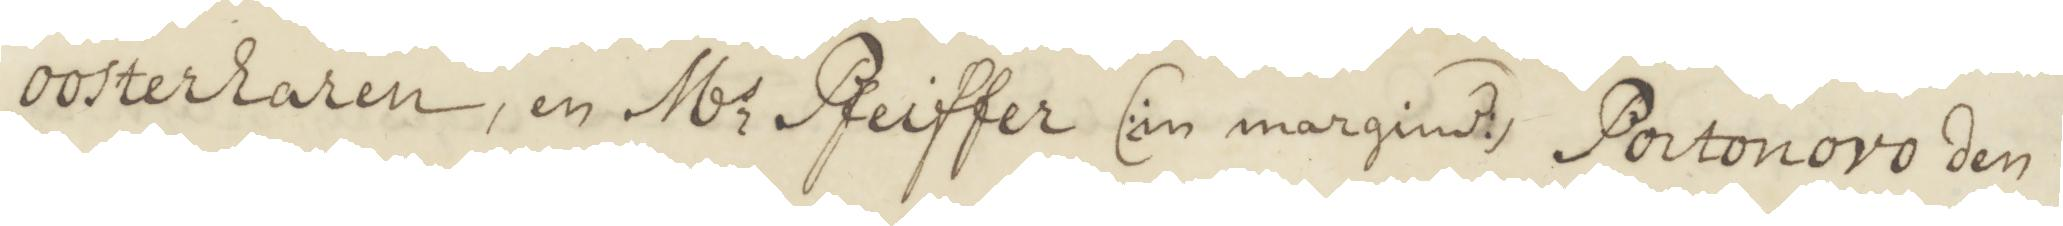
oosterharen, en M:r Pfeiffer (:in margine:) Portonovo den
